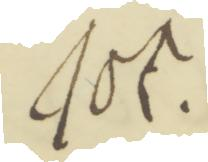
405.
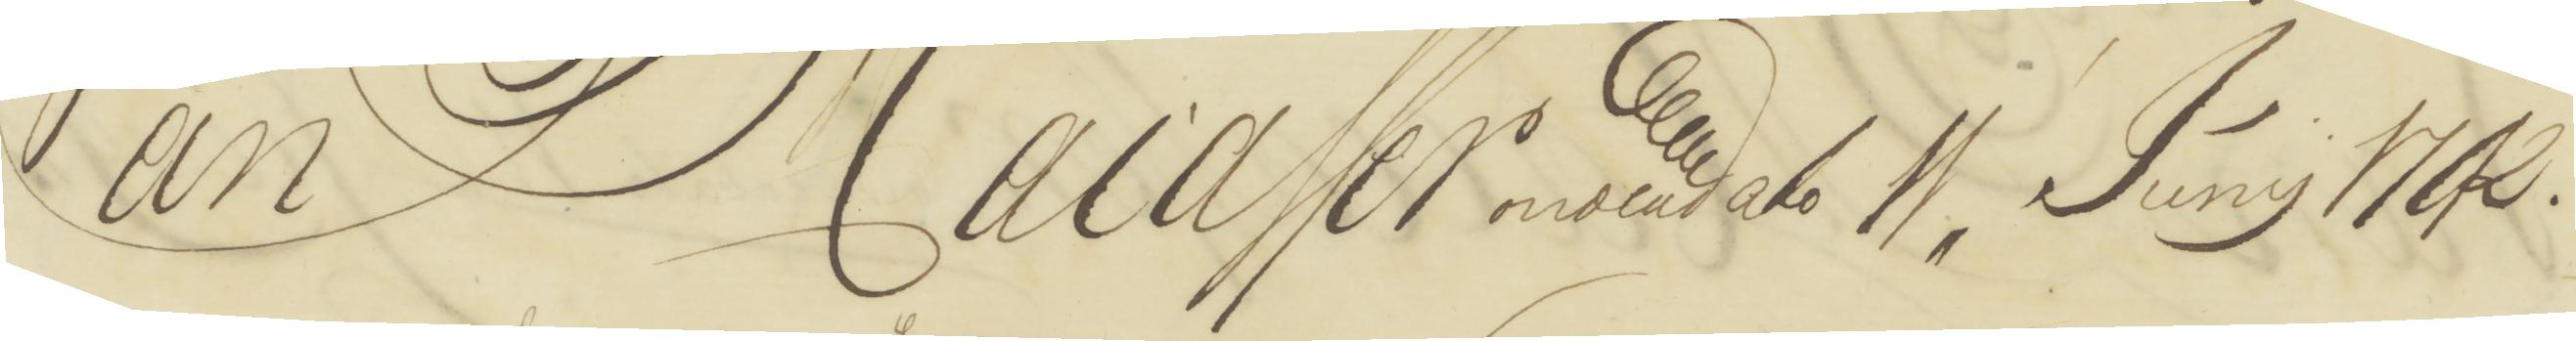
Van Macasser onderdato 11„' Iunij 1742.
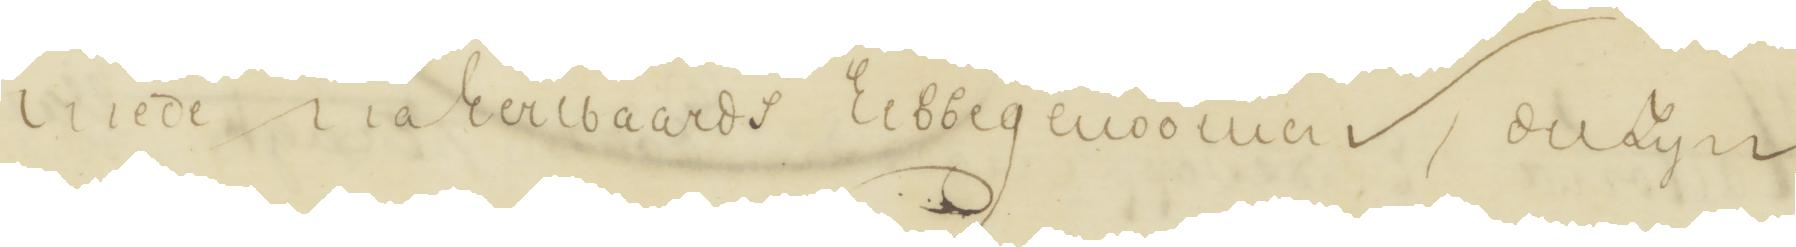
mede na herwaards hebbegenoomen, dezyn
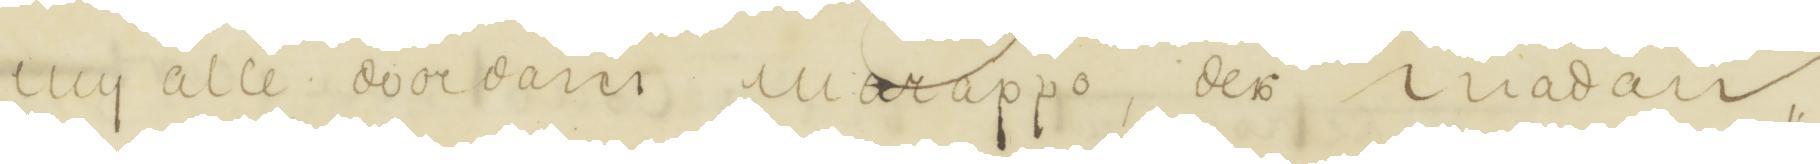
wy alle door dain marappo, der madan„
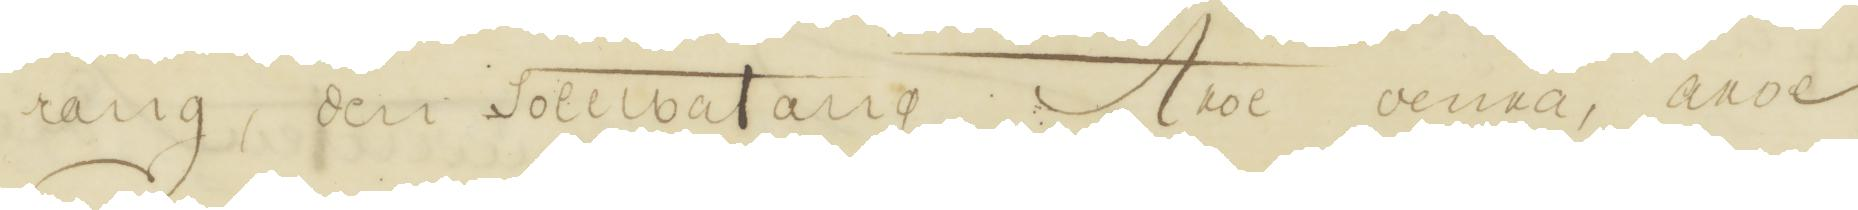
rang, den solewatang Aroe oenra, aroe
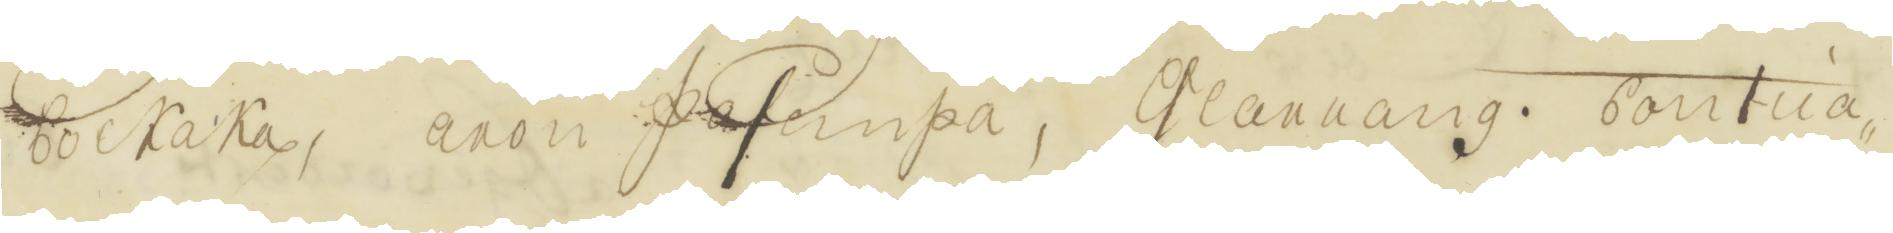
boekaka, aroe pasempa, Glannang. bontua„
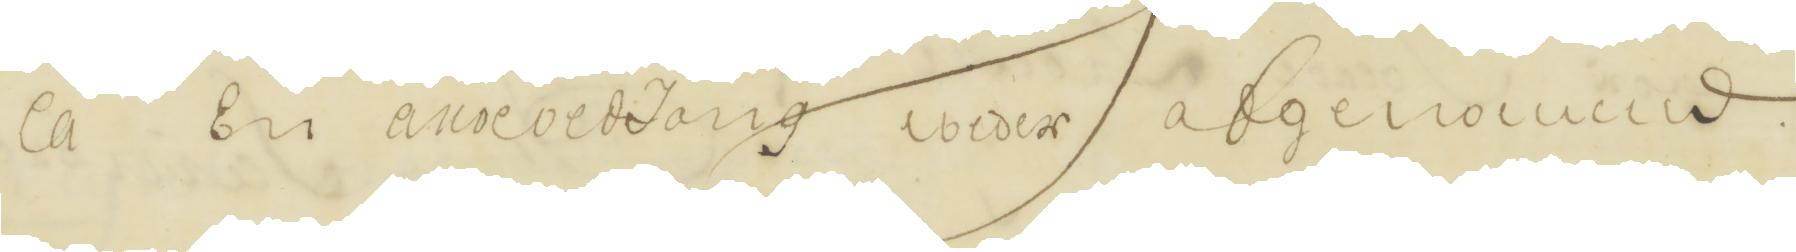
la En aroeoedIang weder afgenomene.
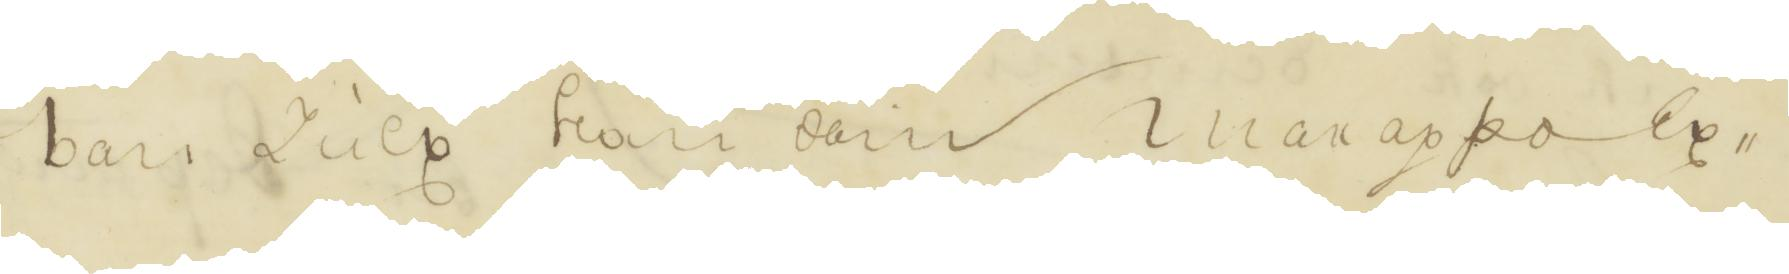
van zulx kan dain marappo Ex„
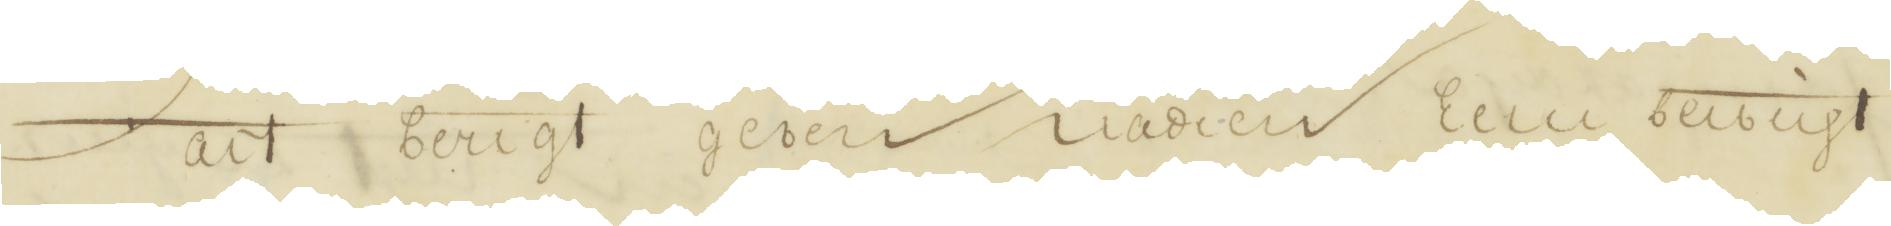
act berigt geven nadien hem berigt
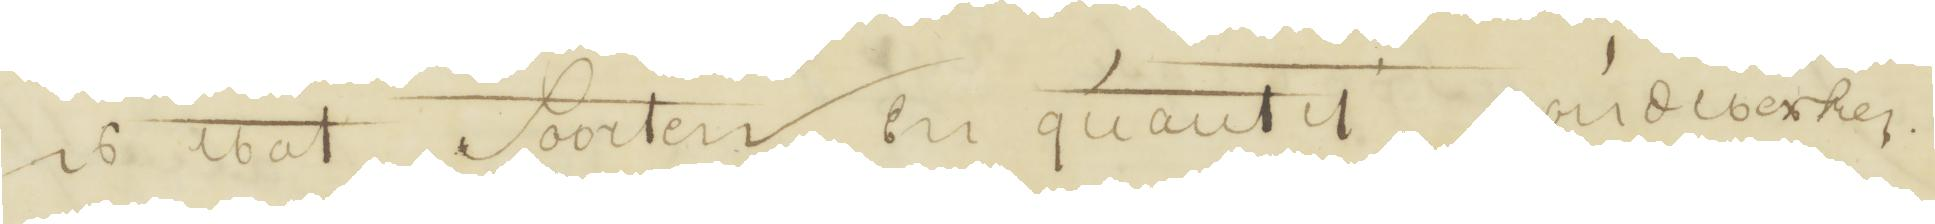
is wat soorten En quantit goudwerken.
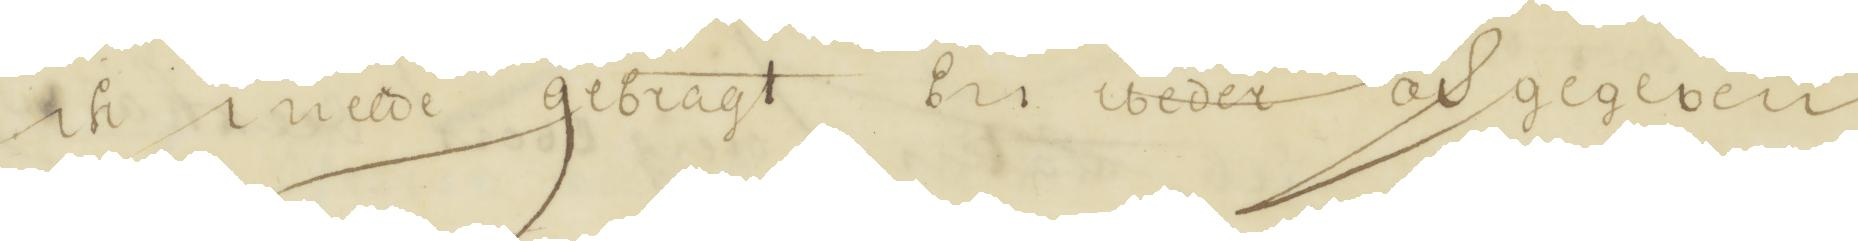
ik meede gebragt En weder overgegeven
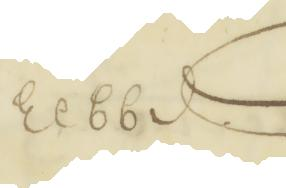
hebbe.
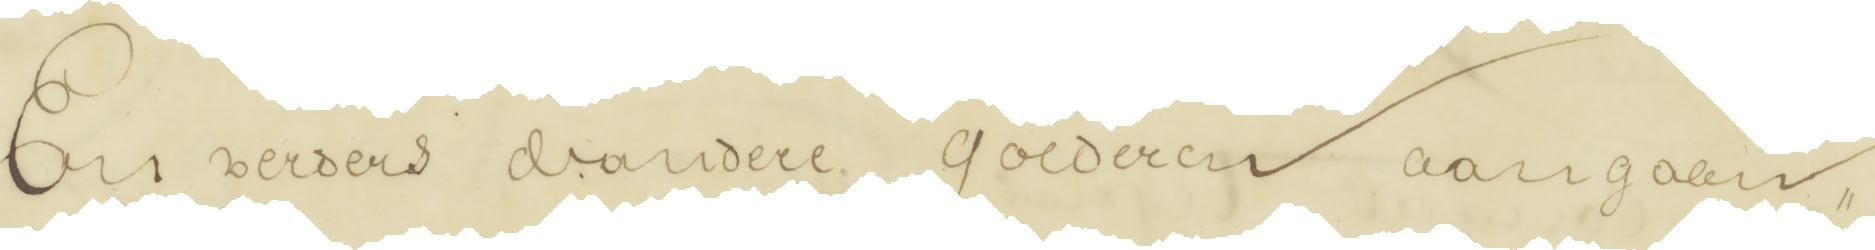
En verders de andere goederen aangaen„
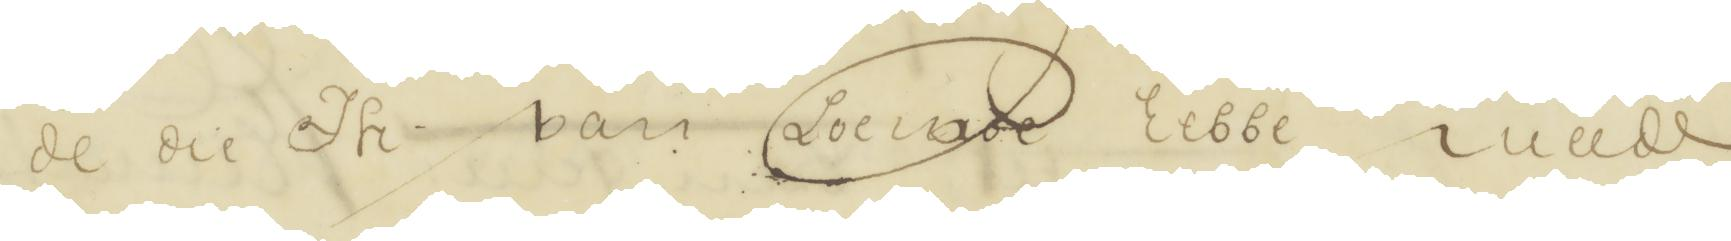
de die Ik - van Loenere hebbe meede
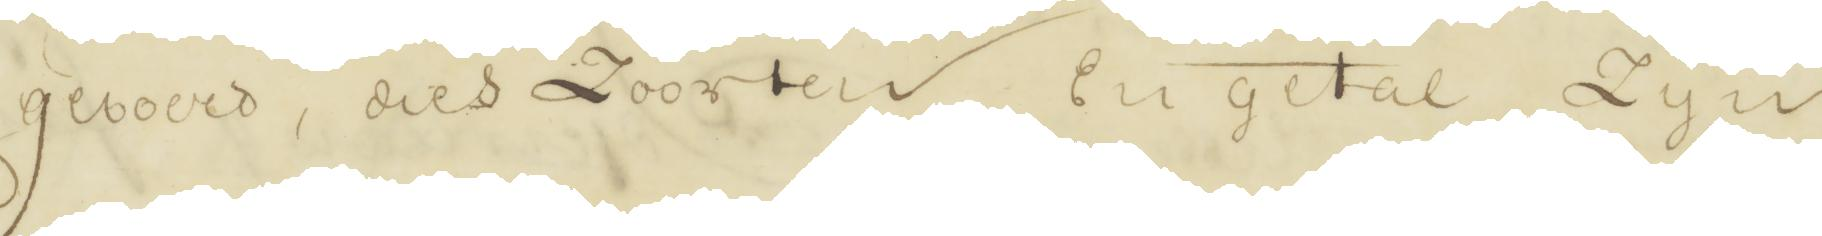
gevoerd, dies zoorten En getal zyn
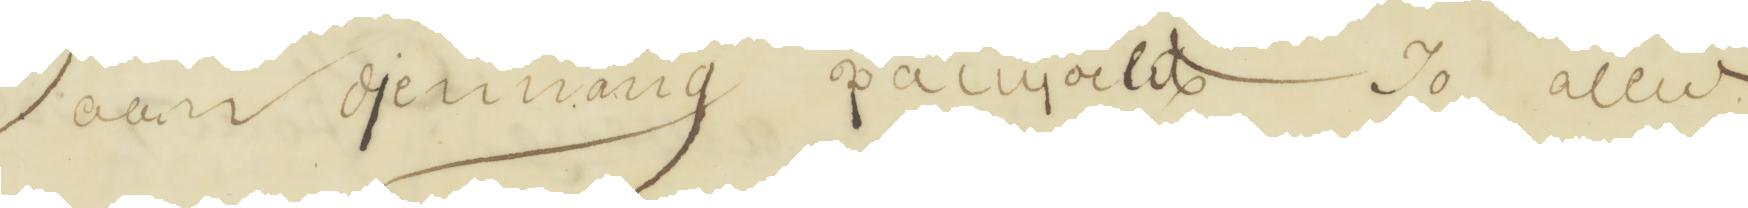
aan djennang panijrlit Io allie
